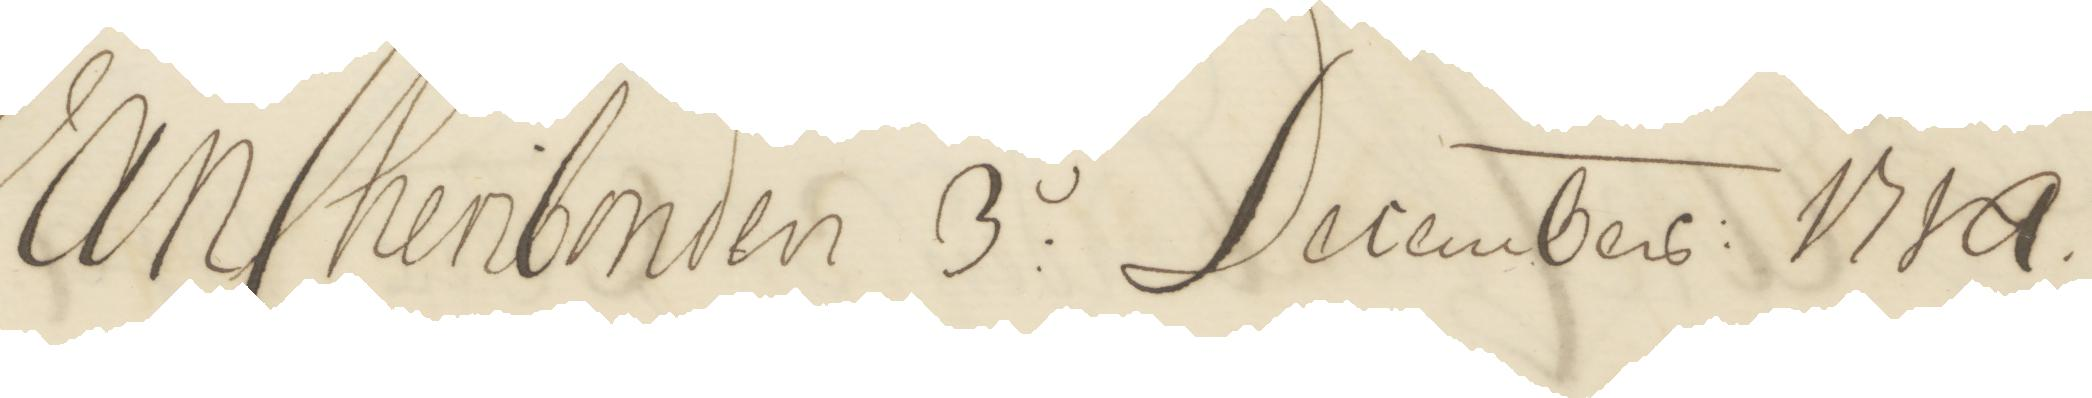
Van Cheribon den 3:' December: 1714.
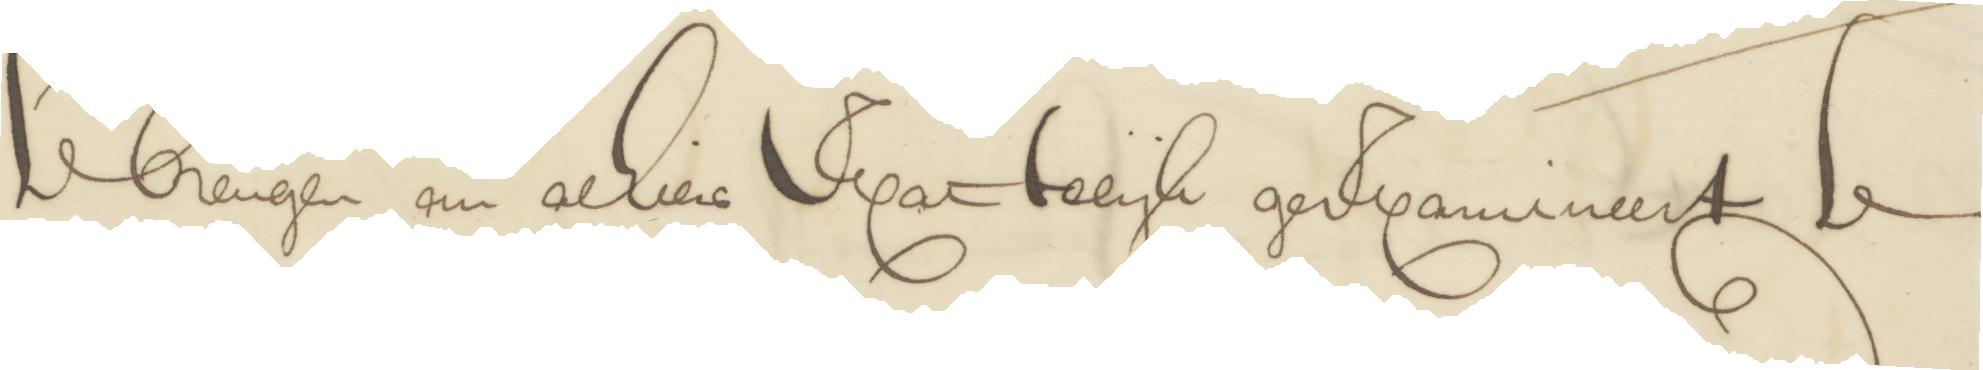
te brengen om alhier Exactelijk geExamineert te
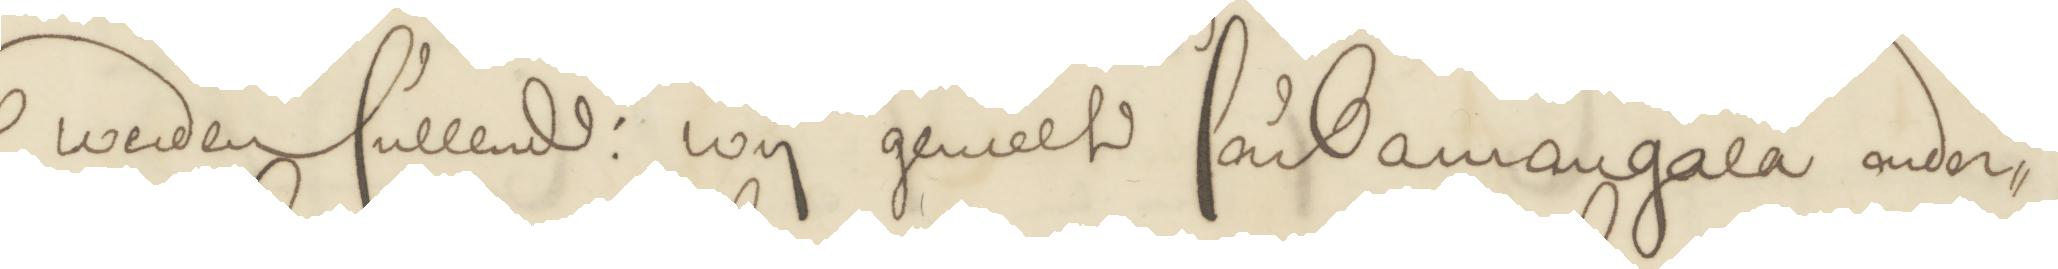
werden sullende: wij gemelte soubamangala onder„
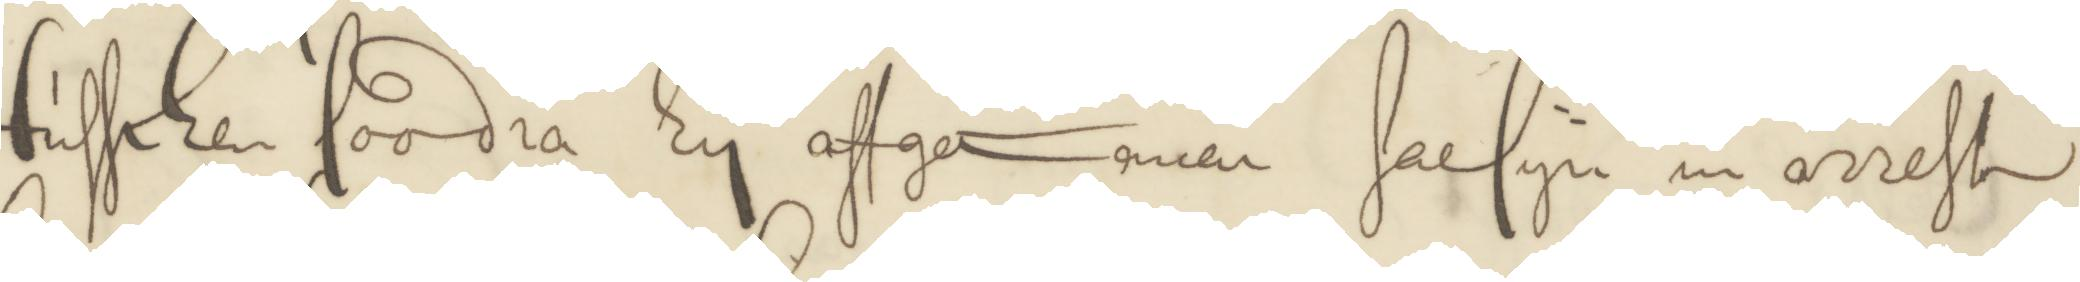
tusschen soodra hij affgecomen sal sijn in arrest
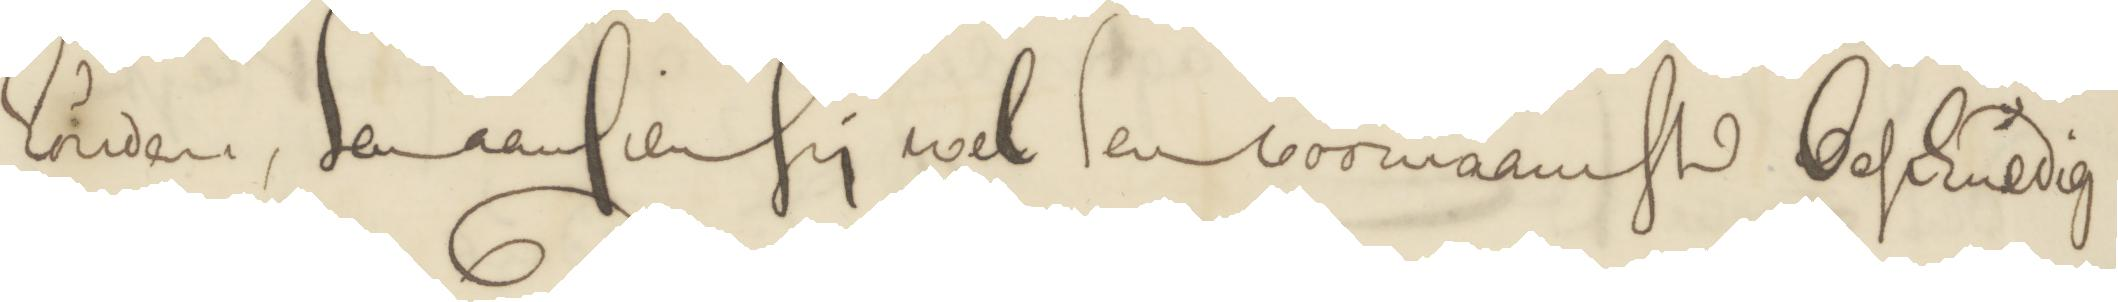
houden, ten aansien sij wel ten voornaamste beschuldig
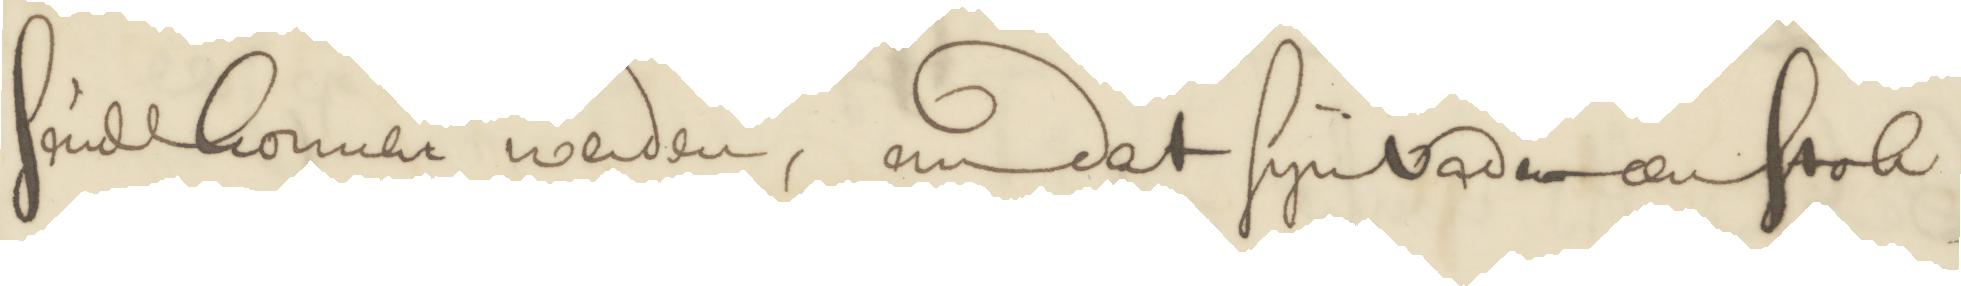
soude konnen werden, om dat sijn vader een stok
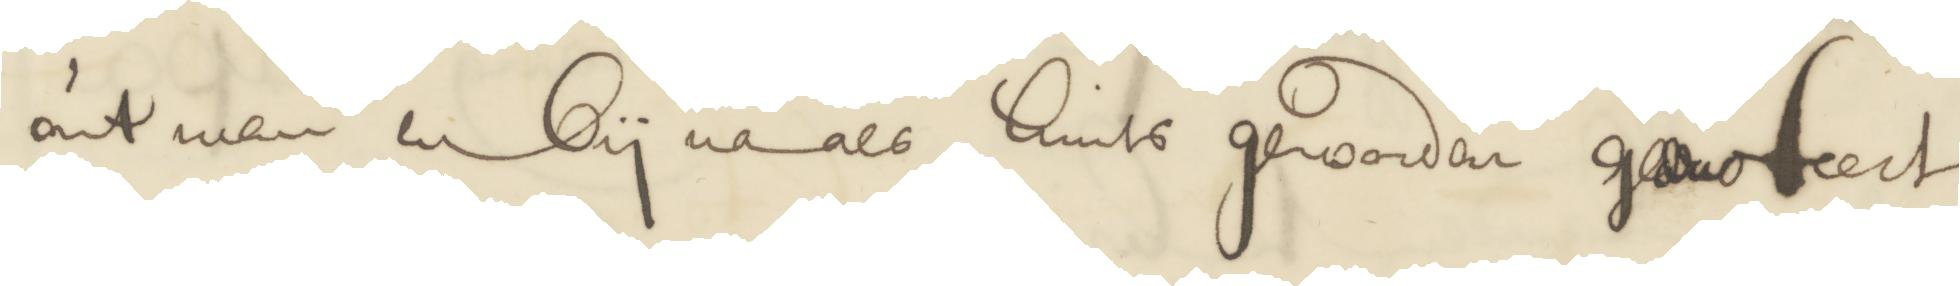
out man en bij na als kints geworden gedenoteert
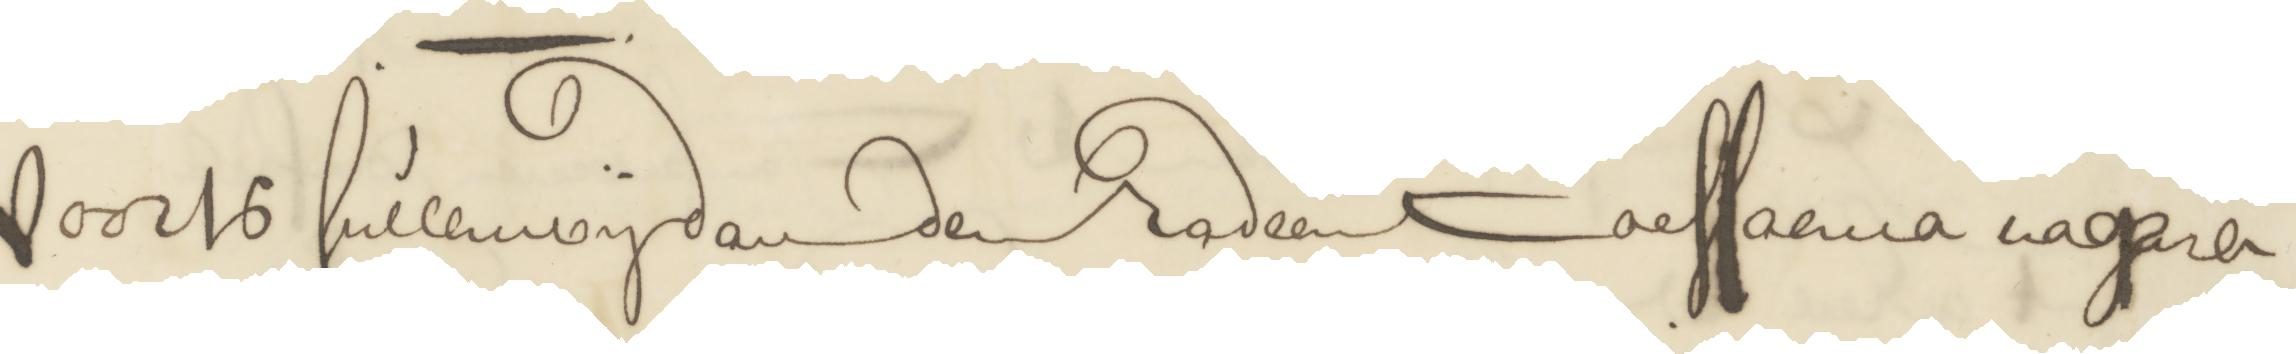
voorts sullen wij dan den radeen coessoema nagara
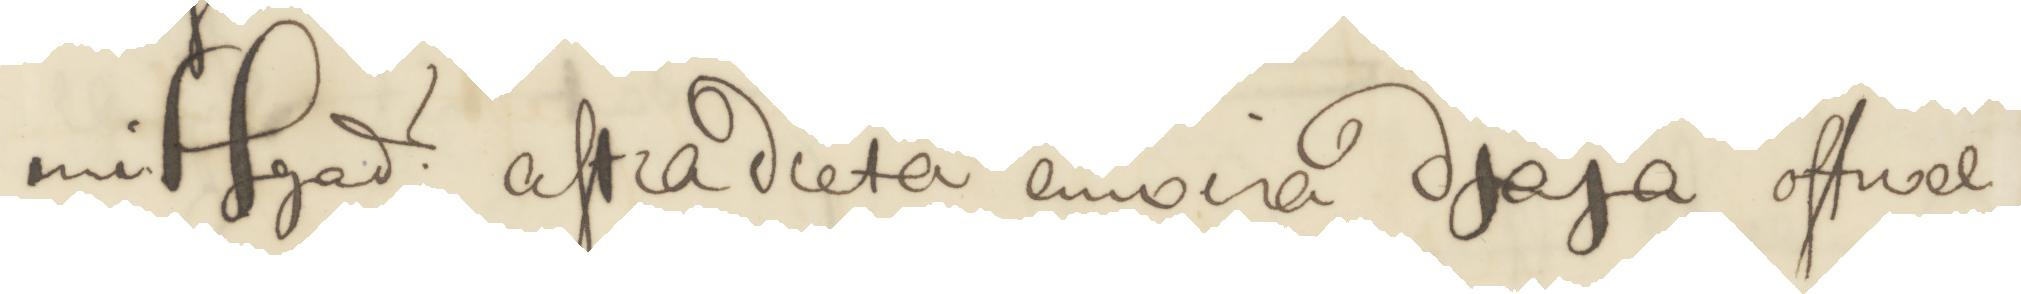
mitsgad:s astra dieta enwira djaja offwel
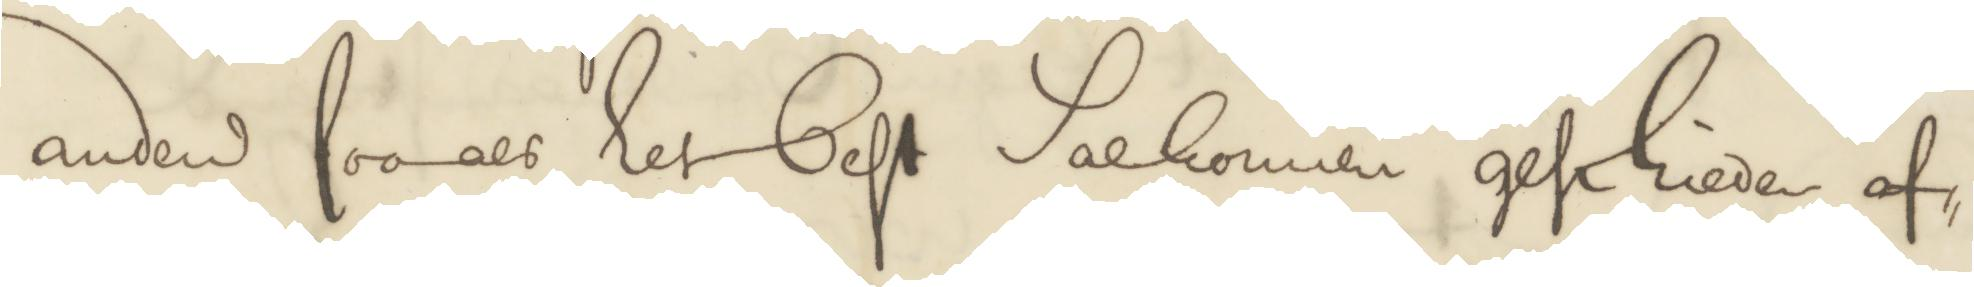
andere soo als het best sal konnen geschieden af„
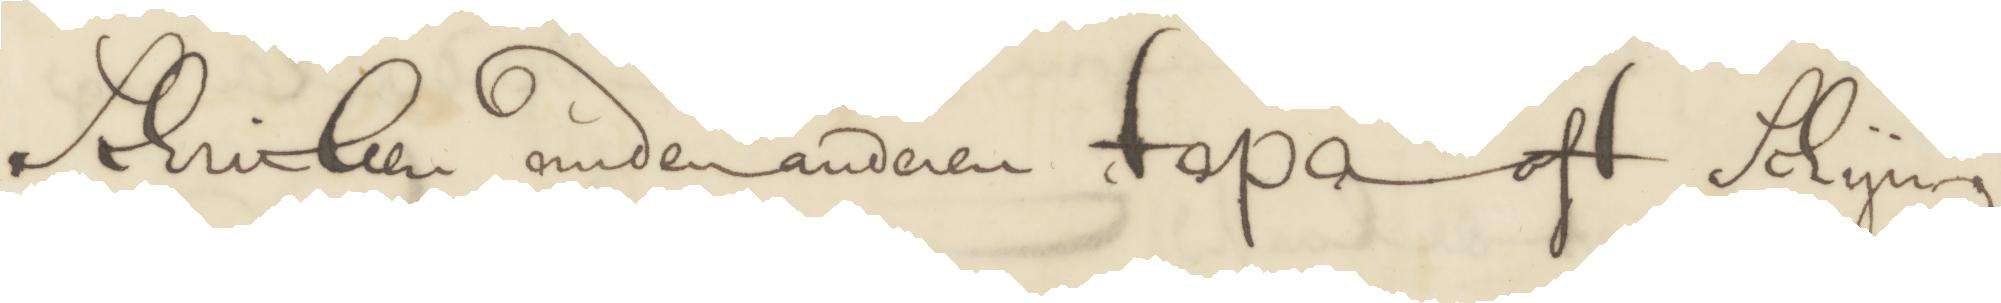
schricken om den anderen tapa oft schijn
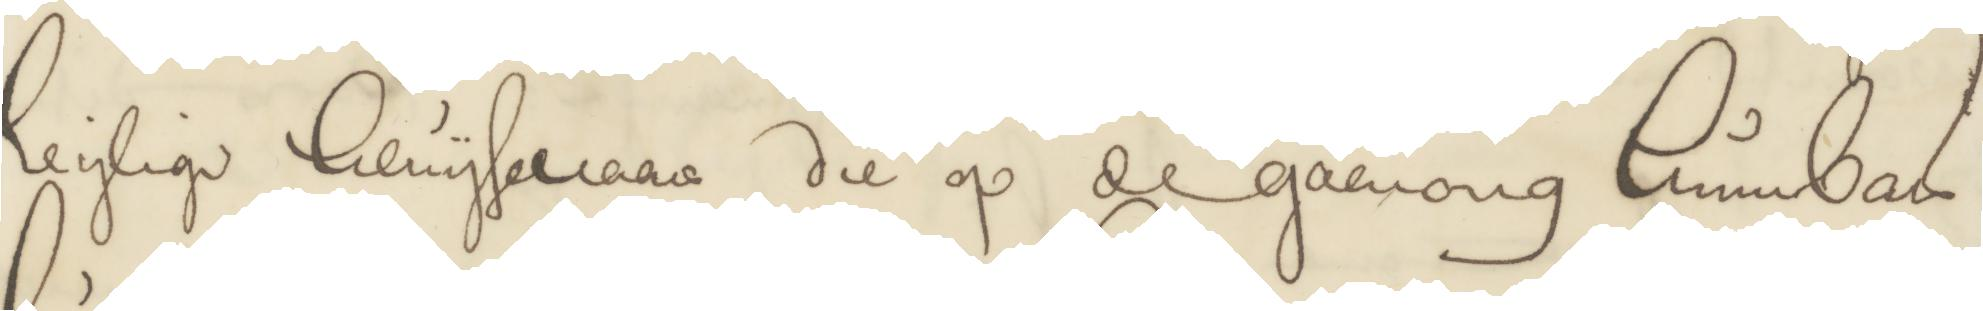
heijlige kluijsenaar die op de gaenong kumbar
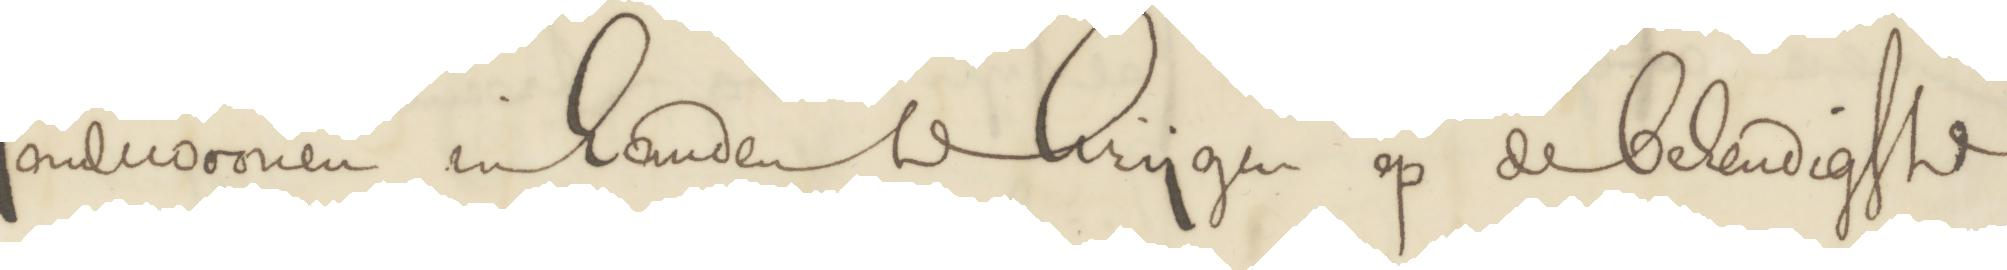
soude woonen in handen te krijgen op de behendigste
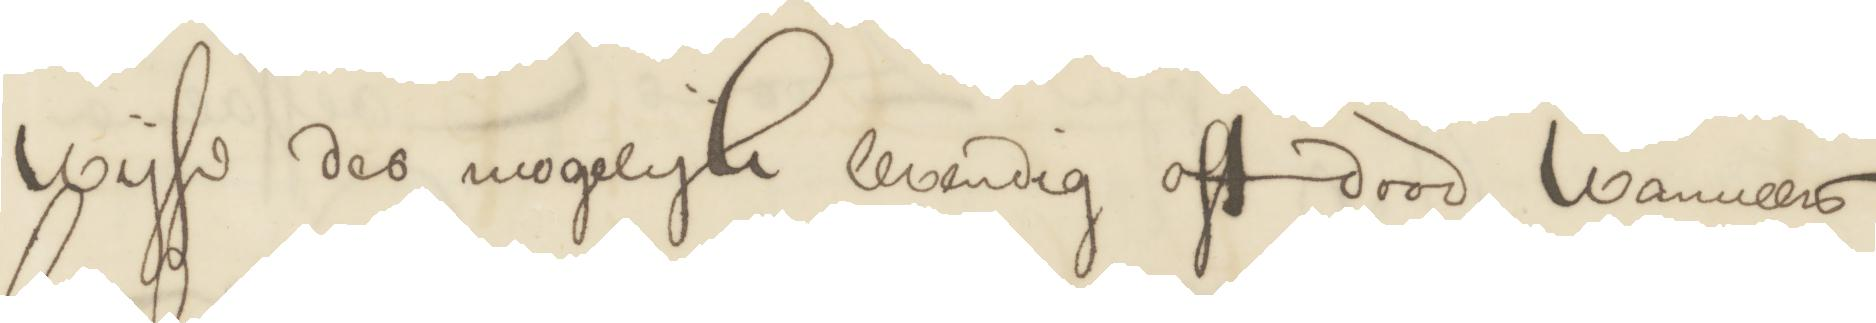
wijse des mogelijk levendig oft dood wanneers
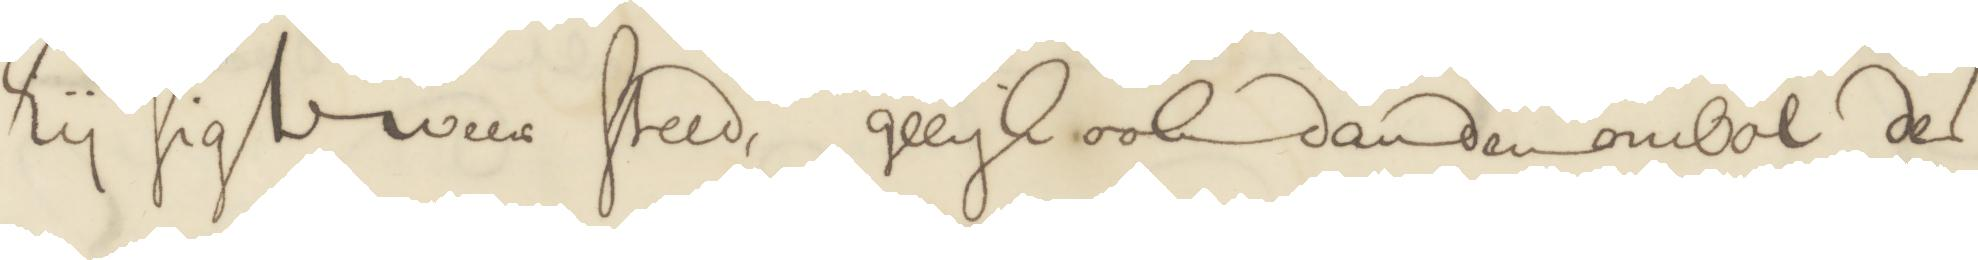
hij sig te weer steed, gelijk ook dan den ombol des
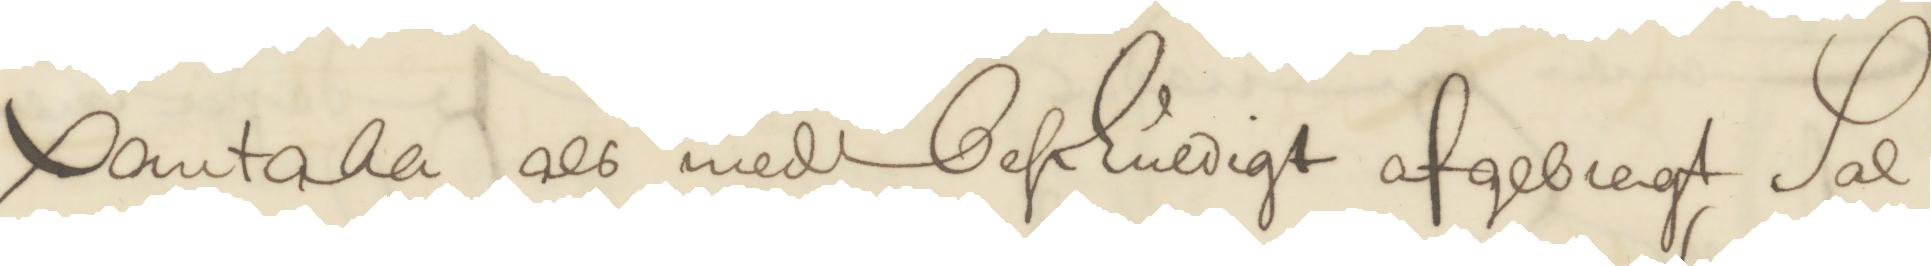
pantala als mede beschuldigt afgebragt sal
